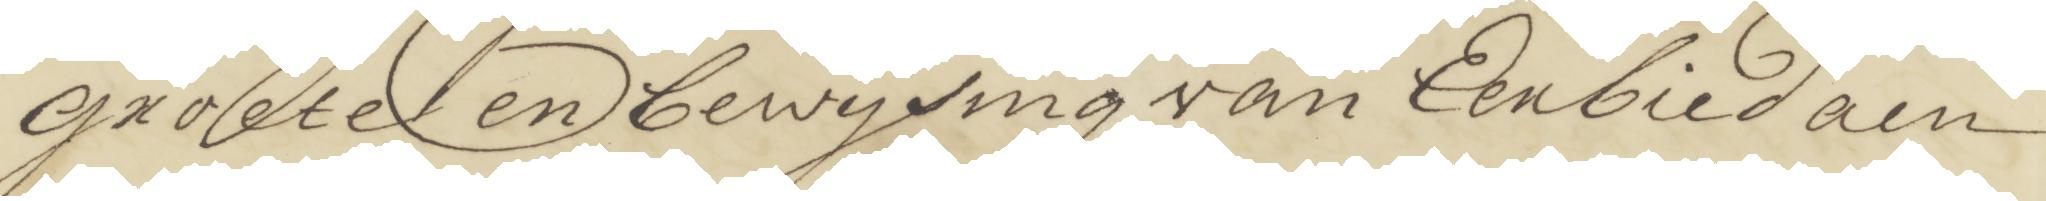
groete en bewijsing van Eerbied aen
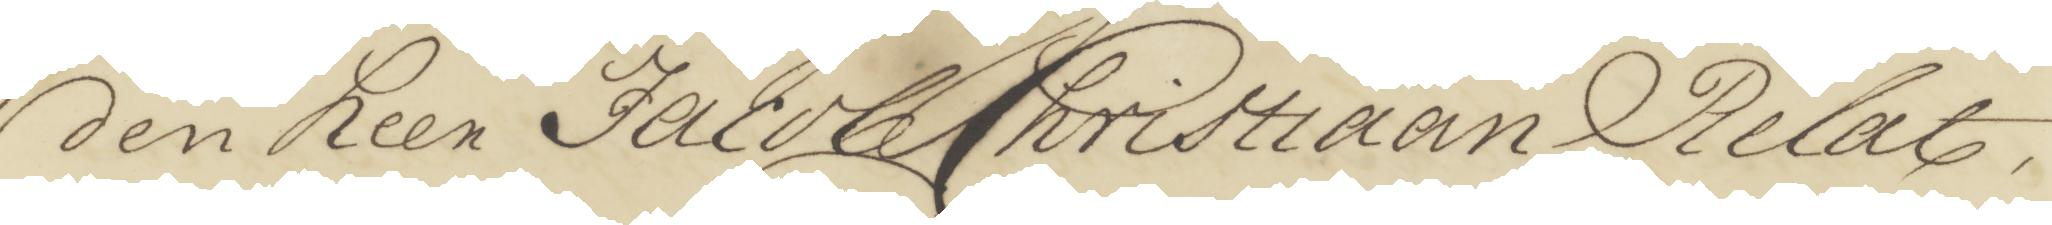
den heer Iacob Christiaan Pielat,
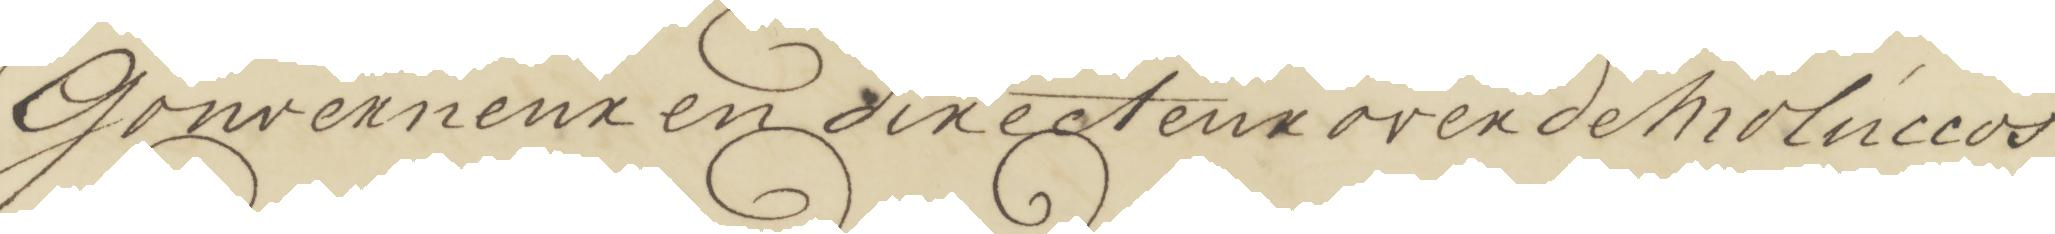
Gouverneur en directeur over de Moluccos
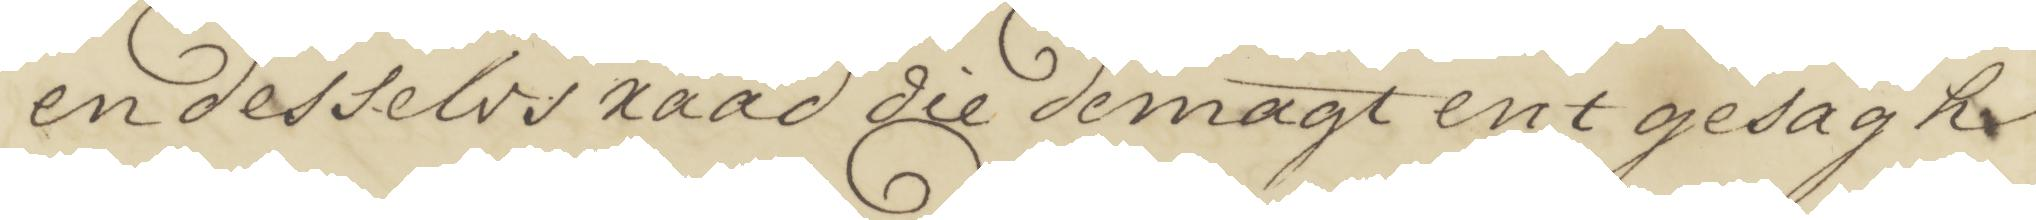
en desselvs raad die demagt en ’t gesagh
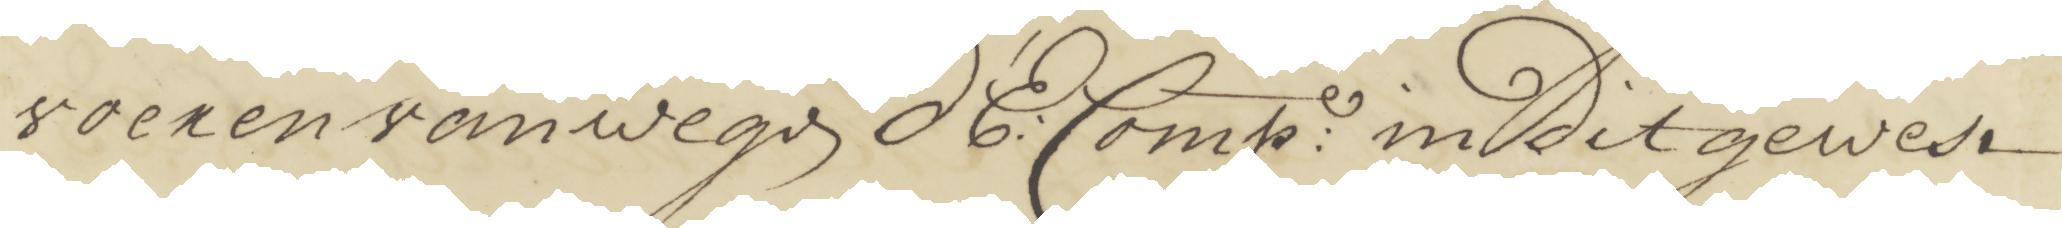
voeren van wegen d' E:Comp:e in dit gewest
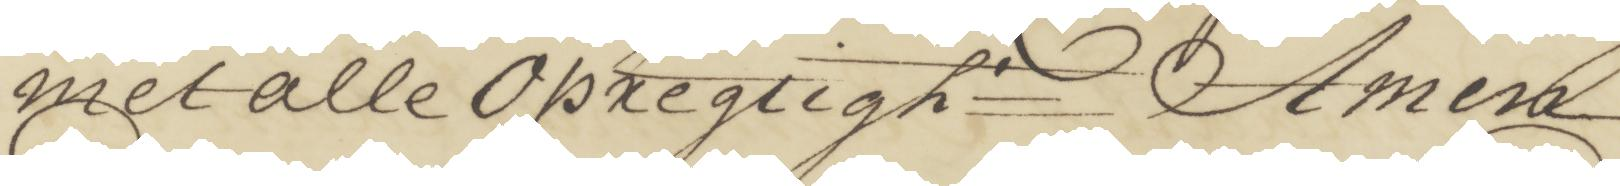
met alle opregtigh=t Amen.
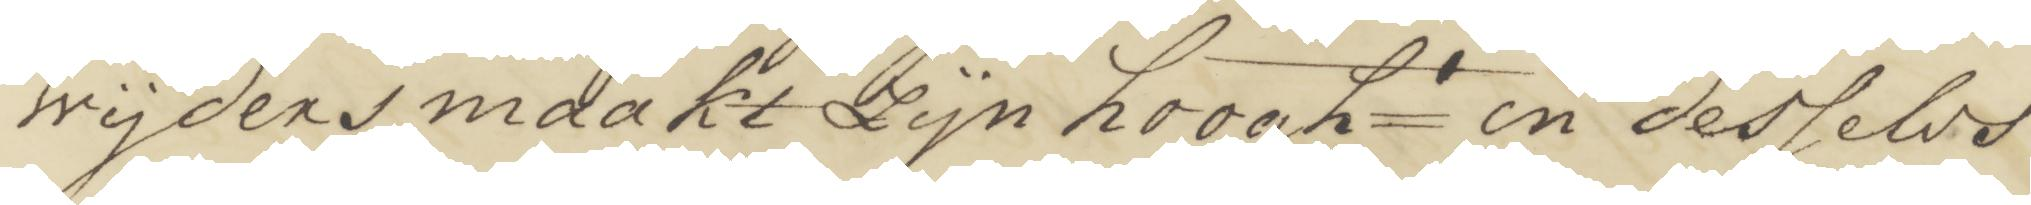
wijders maakt zijn hoogh=t en desselvs
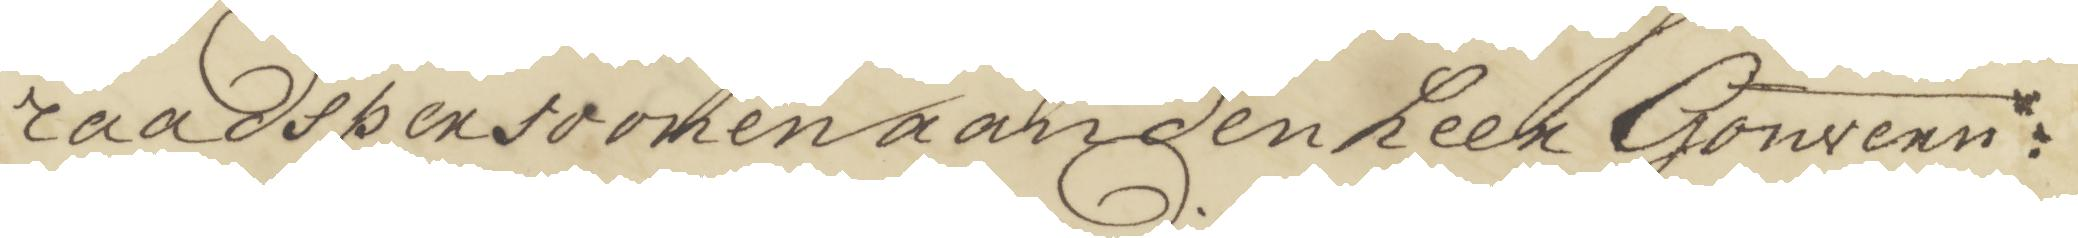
raadspersoonen aan den heer Gouvern:r
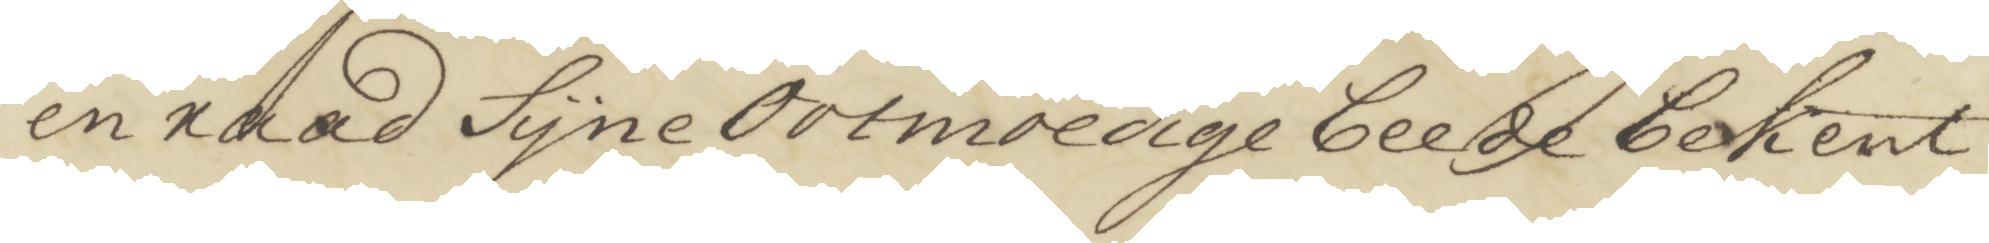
en raad Sijne Ootmoedige beede bekent
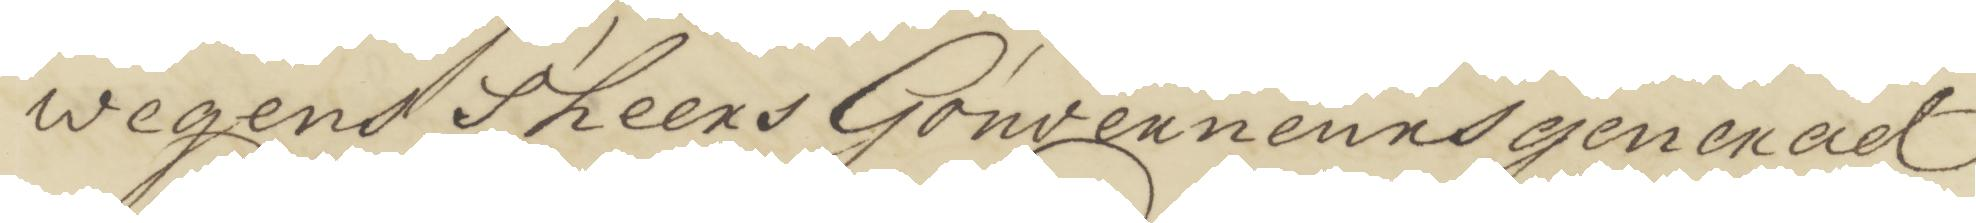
wegens s'heers Gouverneurs generael
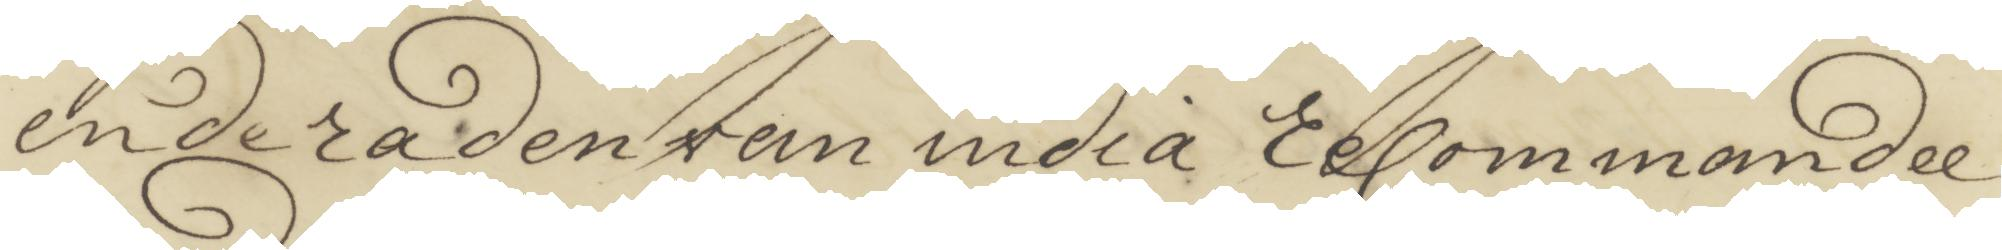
en de raden van india Recommandee
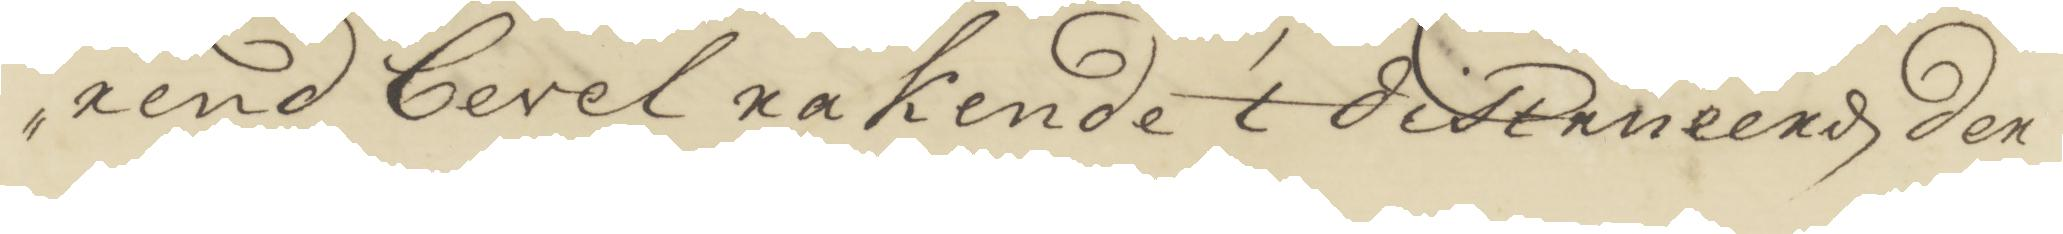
„rend bevel rakende ’t distrueeren der
